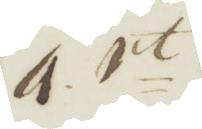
4. v=t
